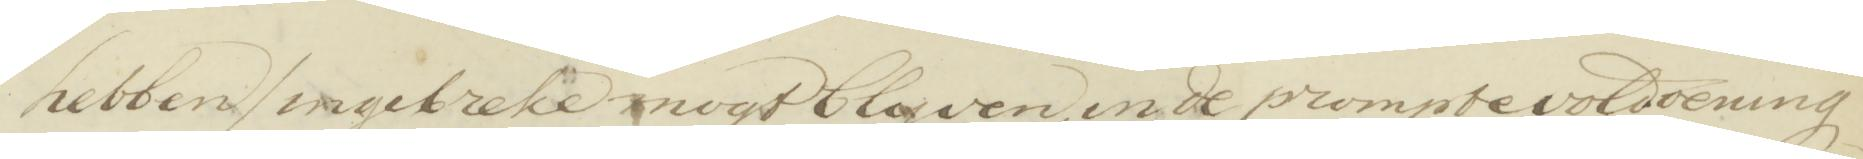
hebben ingebreke mogt blyven, in de prompte voldoening
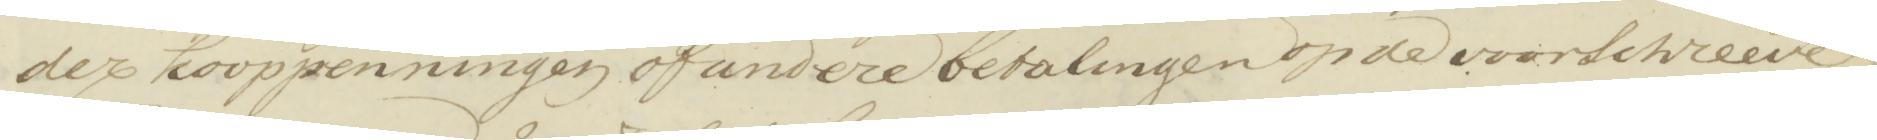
der kooppenningen of andere betalingen op de voorschreeve
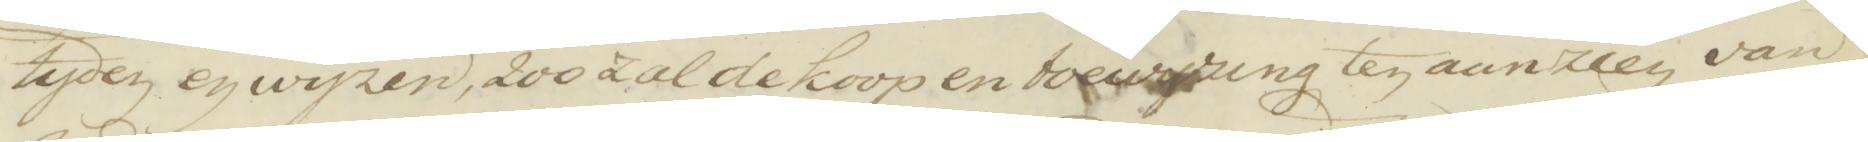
tyden en wyzen, zoo zal de koop en toewyzing ten aanzien van
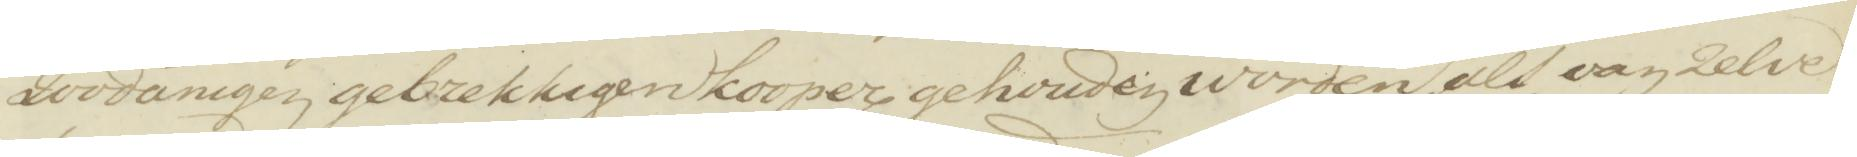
zoodanigen gebrekkigen kooper gehouden worden, als van zelve
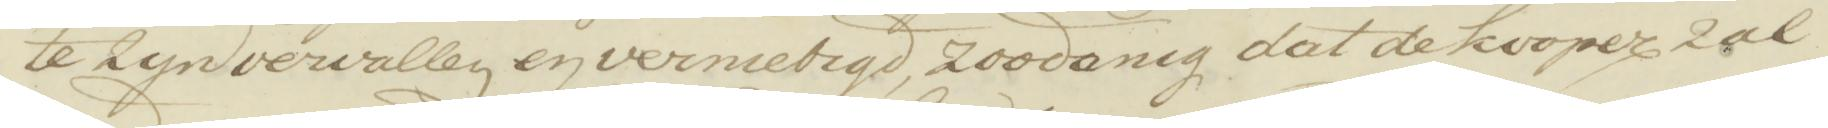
te zyn vervallen en vernietigd, zoodanig dat de kooper zal
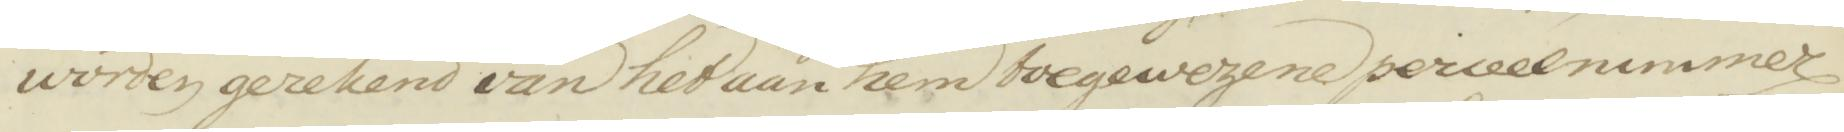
worden gerekend van het aan hem toegewezene perceelnummer
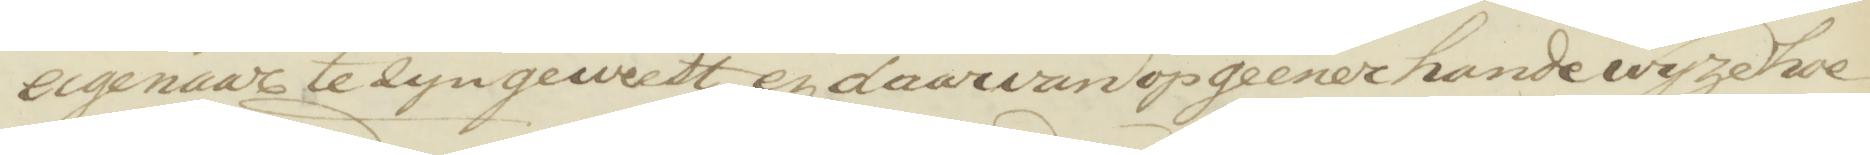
eigenaar te zyn geweest, en daarvan op geener hande wyze hoe
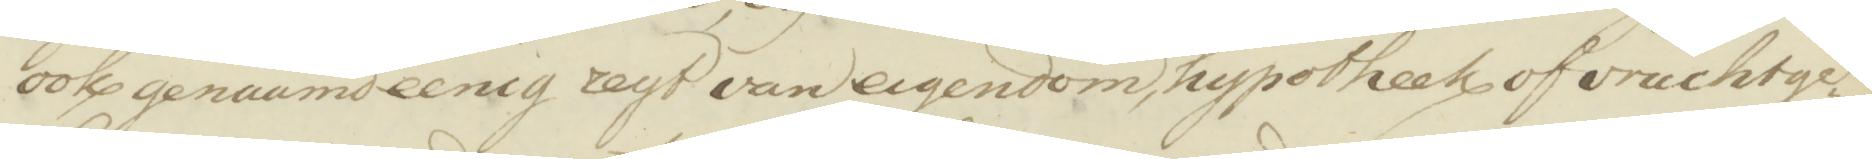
ook genaamd eenig regt van eigendom, hypotheek of vruchtge„
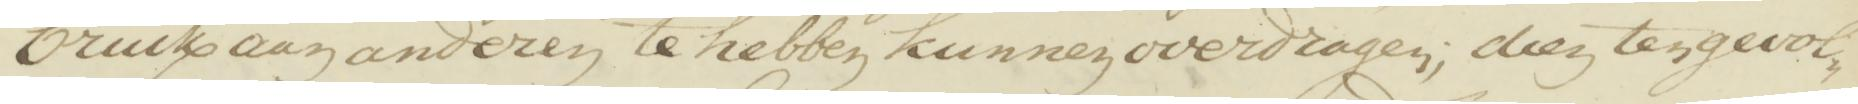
bruik aan anderen te hebben kunnen overdragen; dien ten gevol„
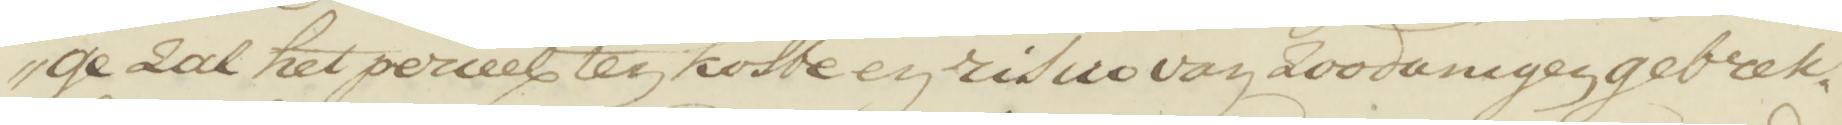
„ge zal het perceel ten koste en risico van zoodanigen gebrek„
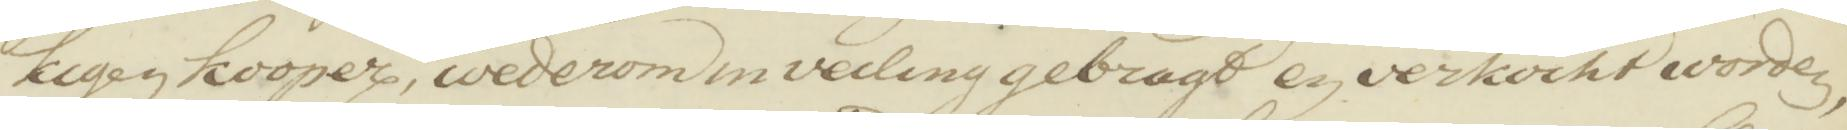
kegen kooper, wederom in veiling gebragt en verkocht worden
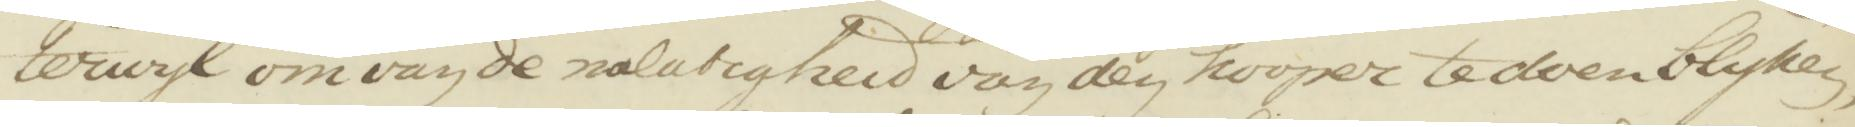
terwyl om van de nalatigheid van den kooper te doen blyken,
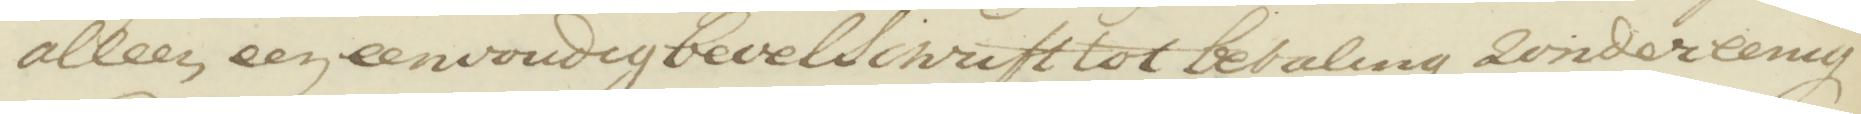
alleen een eenvoudig bevelschrift tot betaling zonder eenig
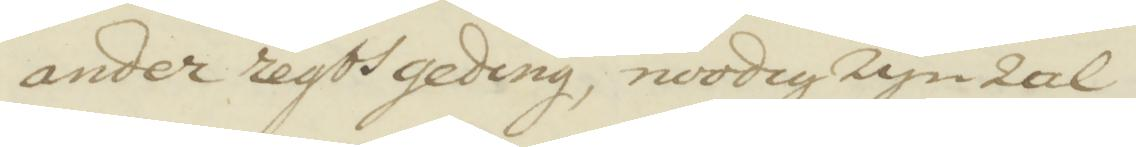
ander regts geding, noodig zyn zal
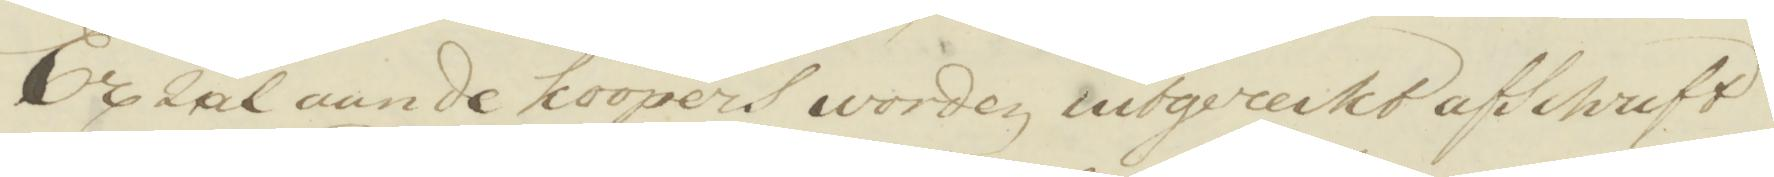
Er zal aan de koopers worden uitgereikt afschrift
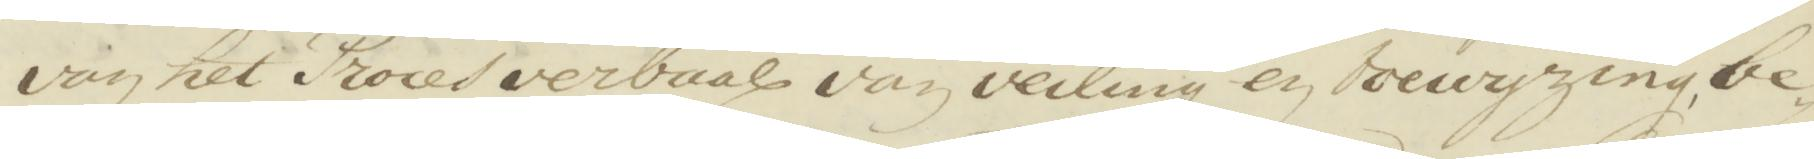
van het Proces verbaal van veiling en toewyzing be„
